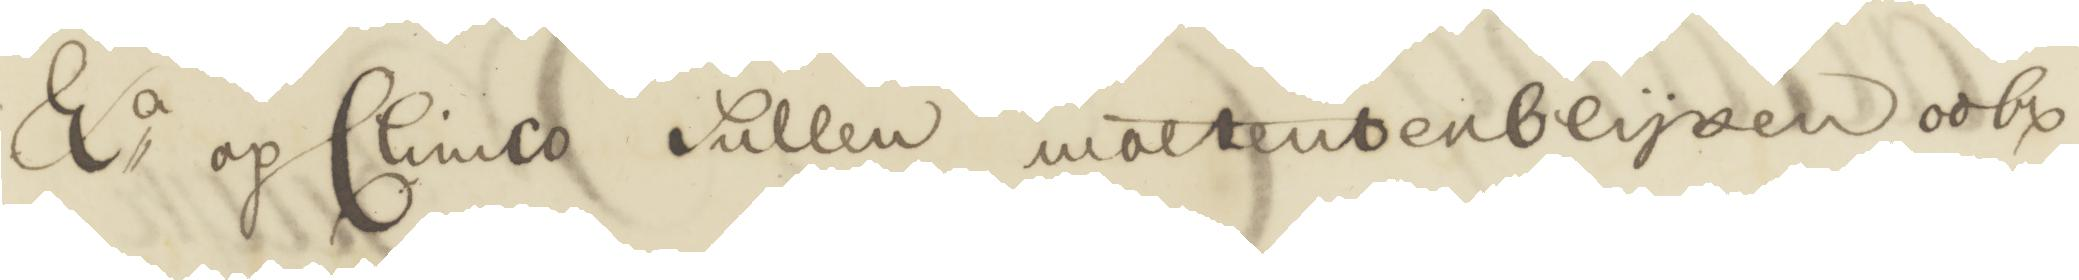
E„a op Chinco sullen moetenverblijven ook
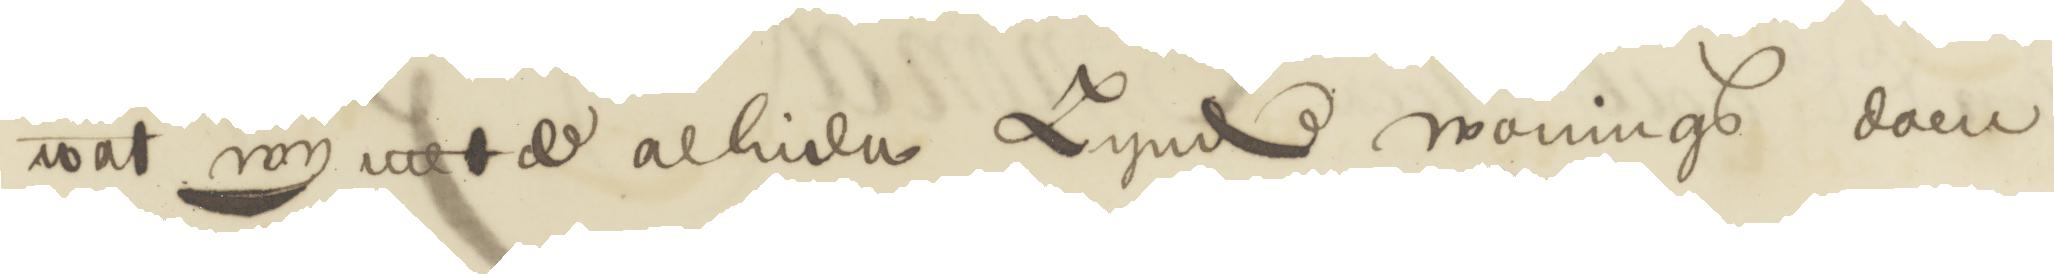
wat wy met de alhier Zynde wonings doen
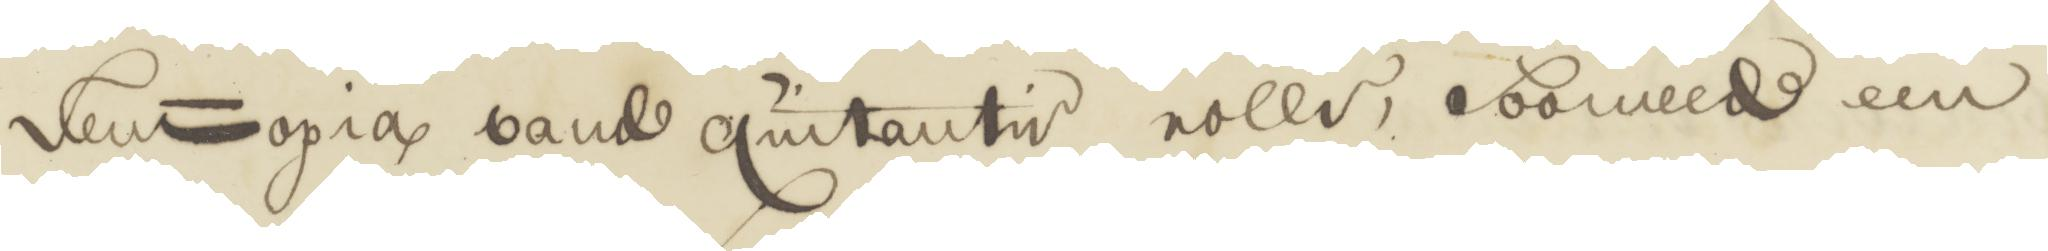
Een Copia van de quitantie rolle, soomeede een
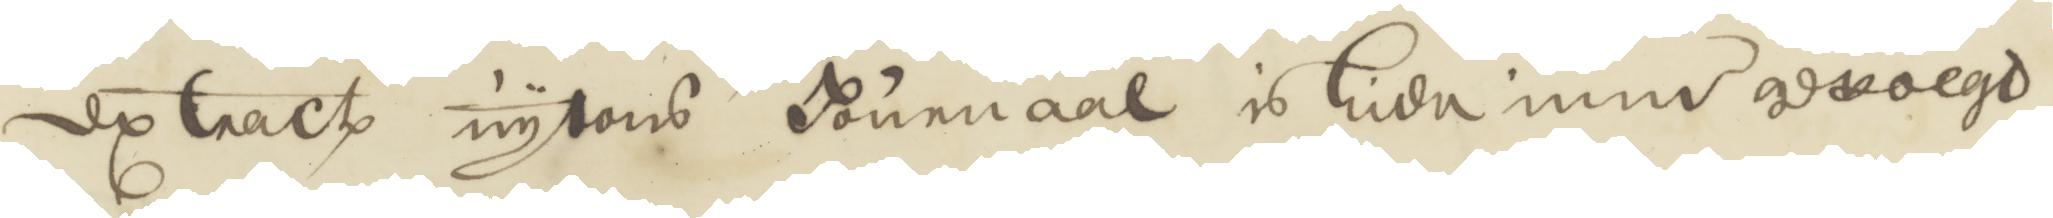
extract uijtons Iournaal is hier inne gevoegd
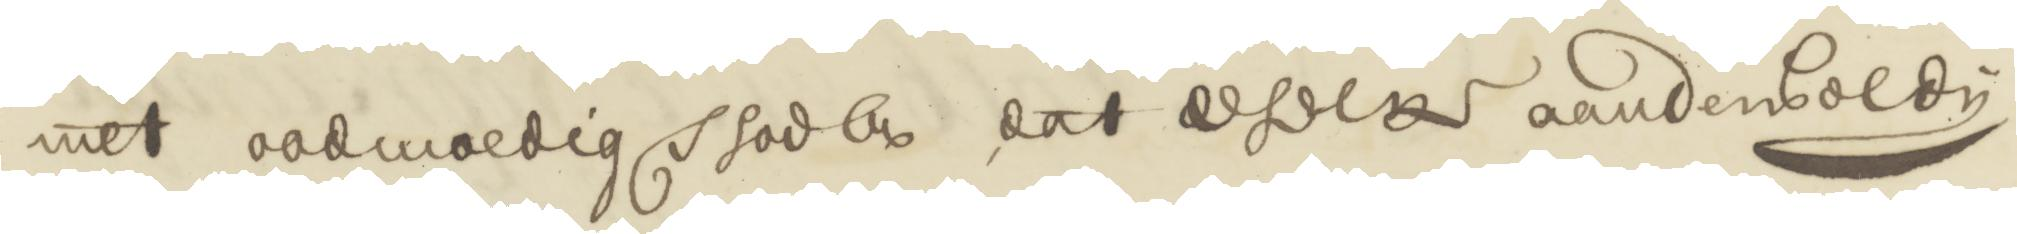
met oodmoedig versoek, dat deselve aandensoldij
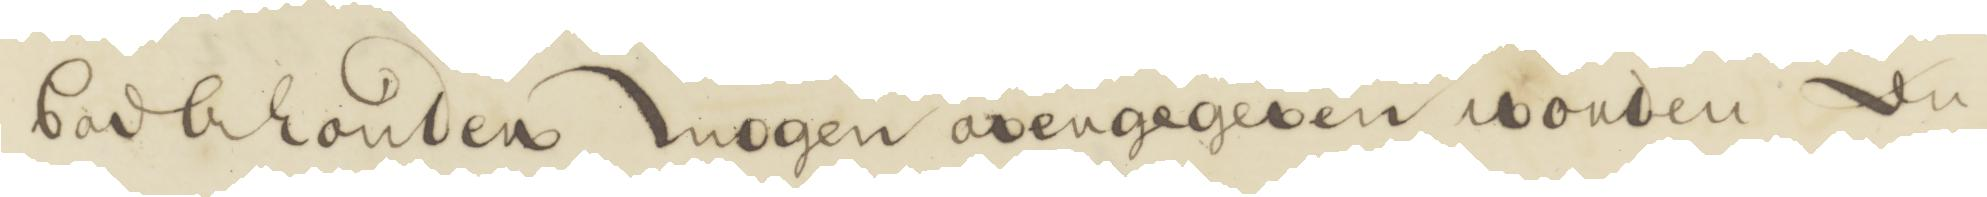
boekhouder mogen overgegeven worden ten
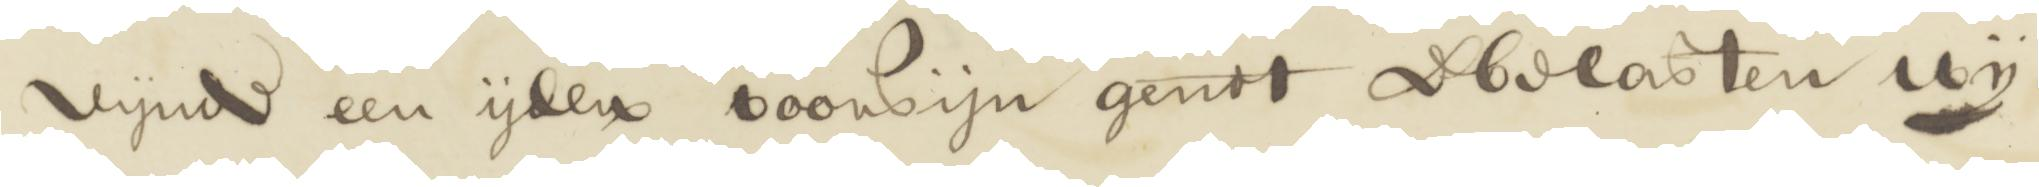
eijnde een ijder voorsijn genot tebelasten wij
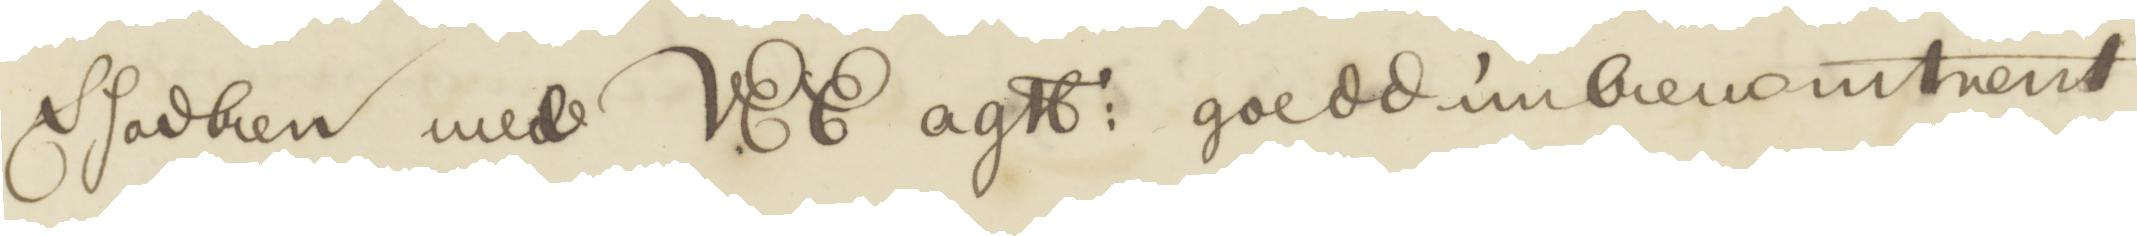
versoeken mede V.EE agtb: goeddunken omtrent
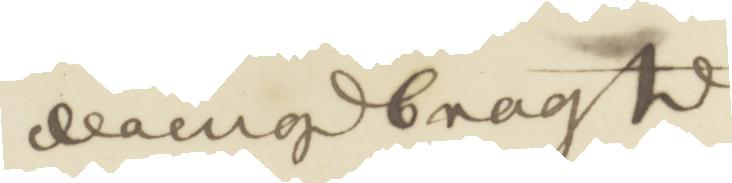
deaengebragte
